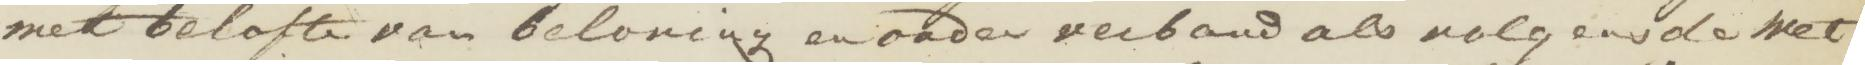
met belofte van beloving en onder verband als volgens de wet
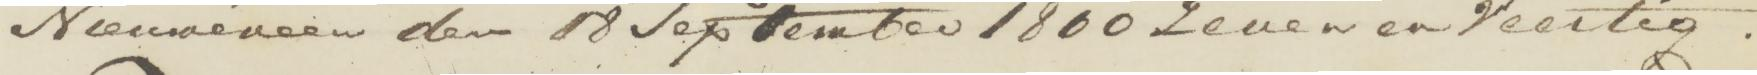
Nieuweveen den 18 September 1800 zeven en Veertig.
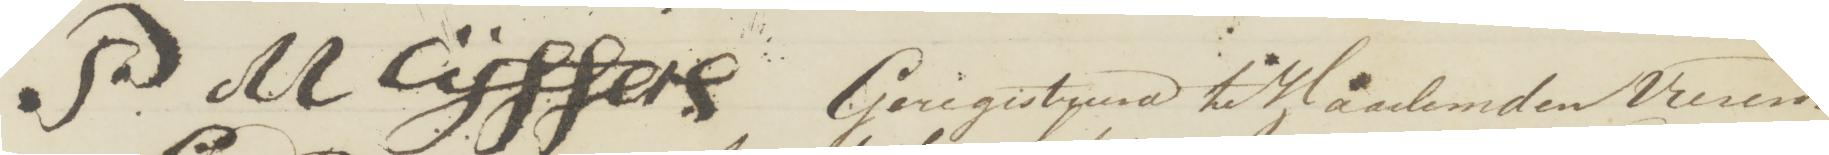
P M Cijffers Geregistreerd te Haarlem den Vieren.
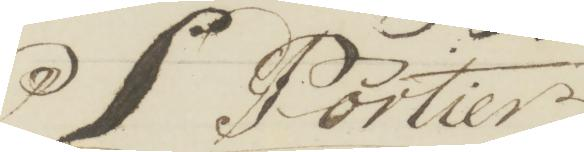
S Portier
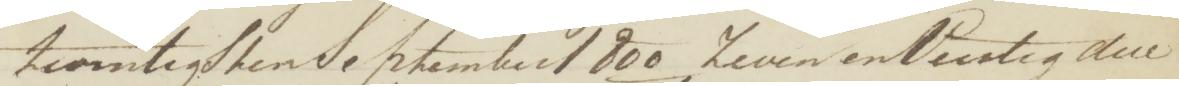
twintigstenSeptember 1800 Zeven enVeertig deel
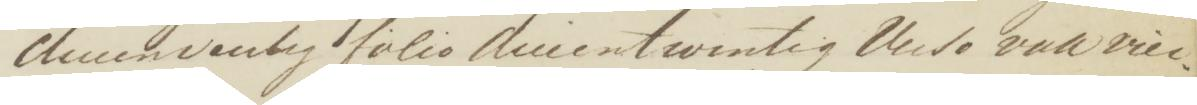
drieenveertig folio drieentwintig Verso vak vier
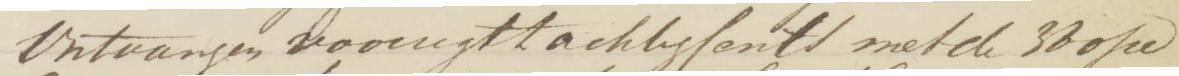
Ontvangen voorregttachtig Cents met de 38opc
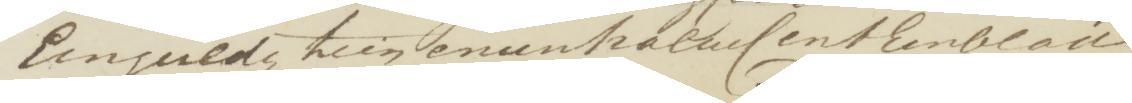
Een gulden tien eneenhalve Cent Eenblad
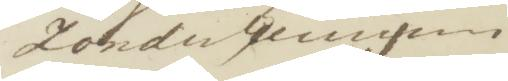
Zonder renvoyen
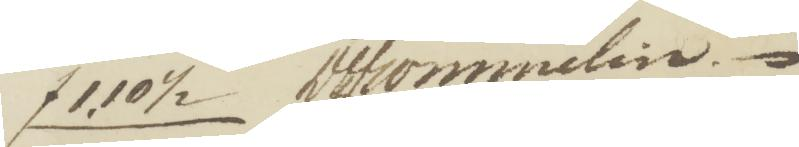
ƒ 1.10½ DFCrommelin. —
